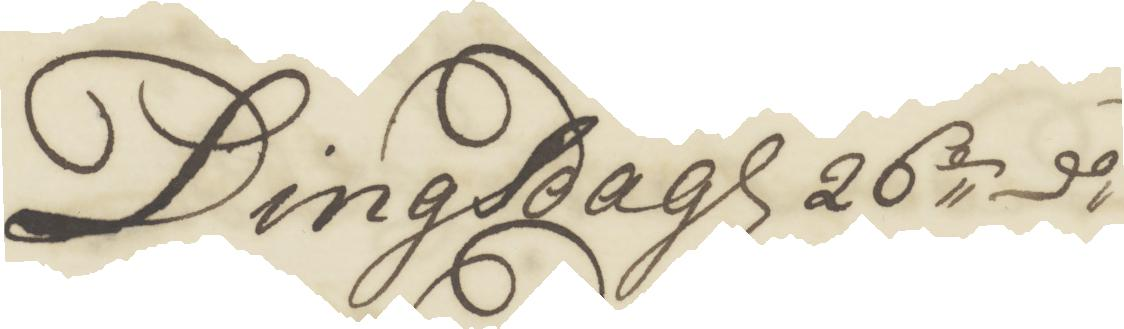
Dingsdagh 26„en _„o
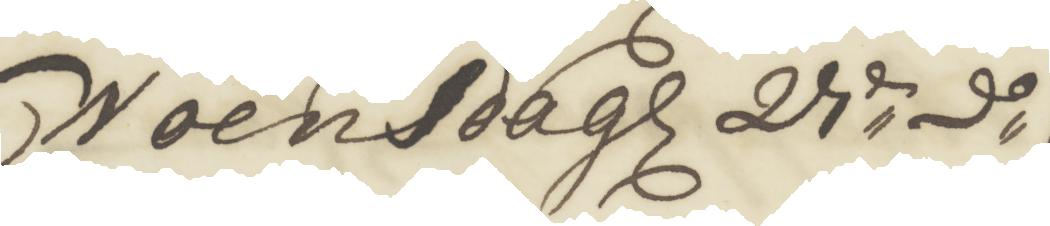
Woensdagh 27„en _„o
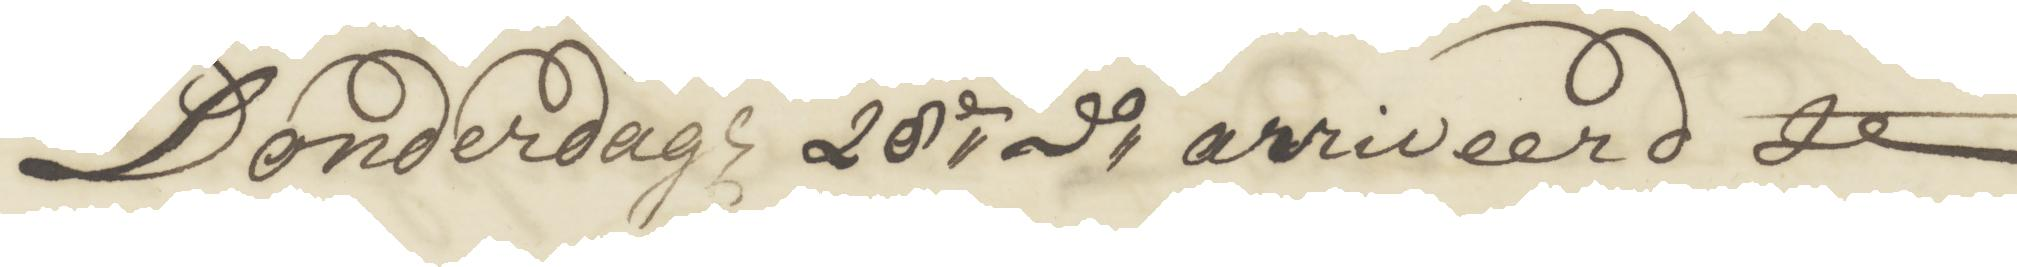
Donderdagh 28„en _„o arriveerd te
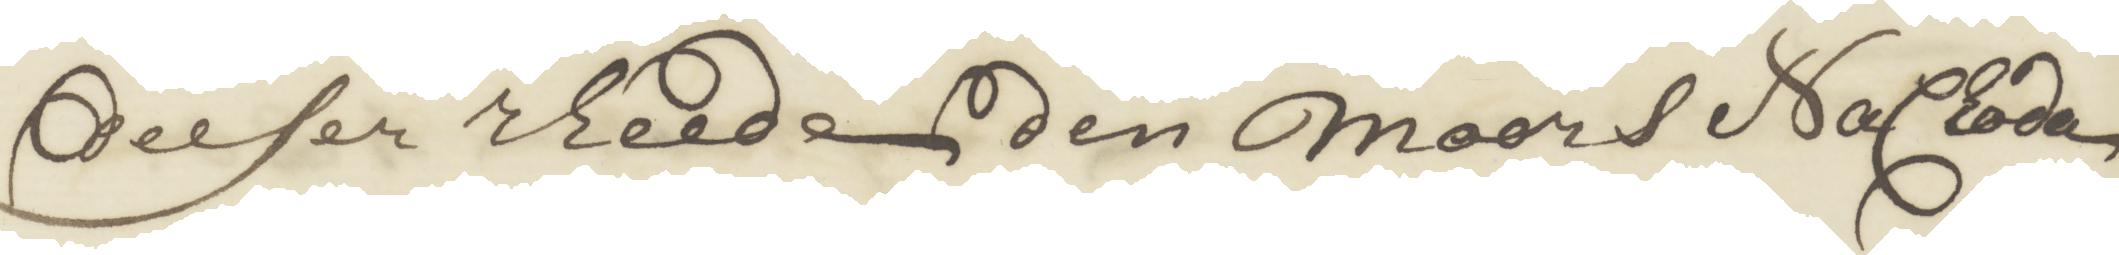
deeser rheede den moors Nachoda
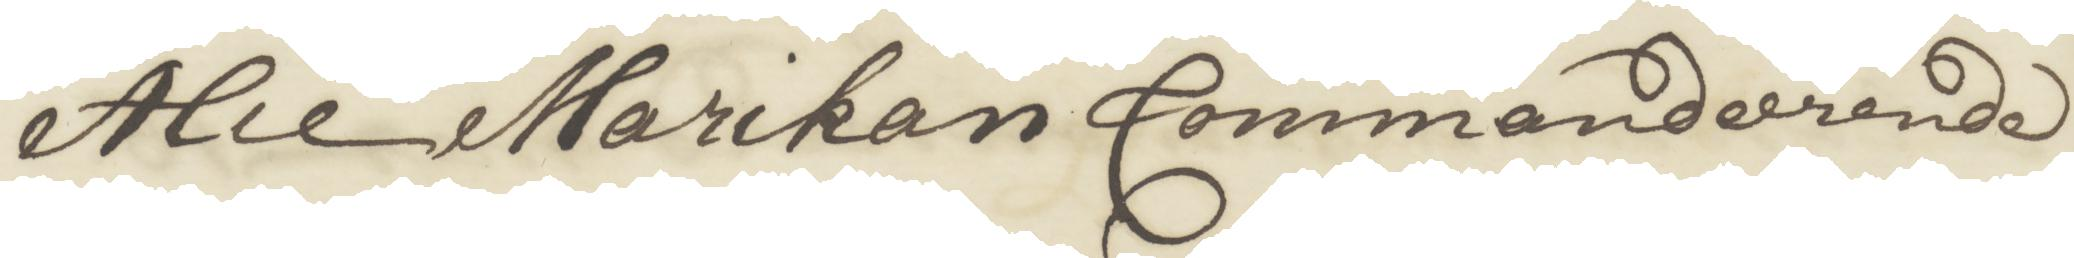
Alie Marikan Commandeerende
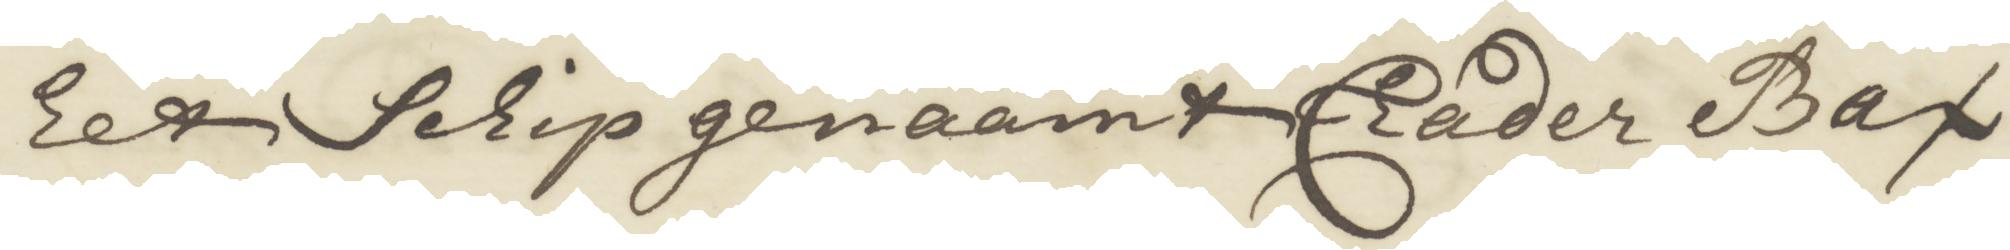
het schip genaamt Chader Bax
